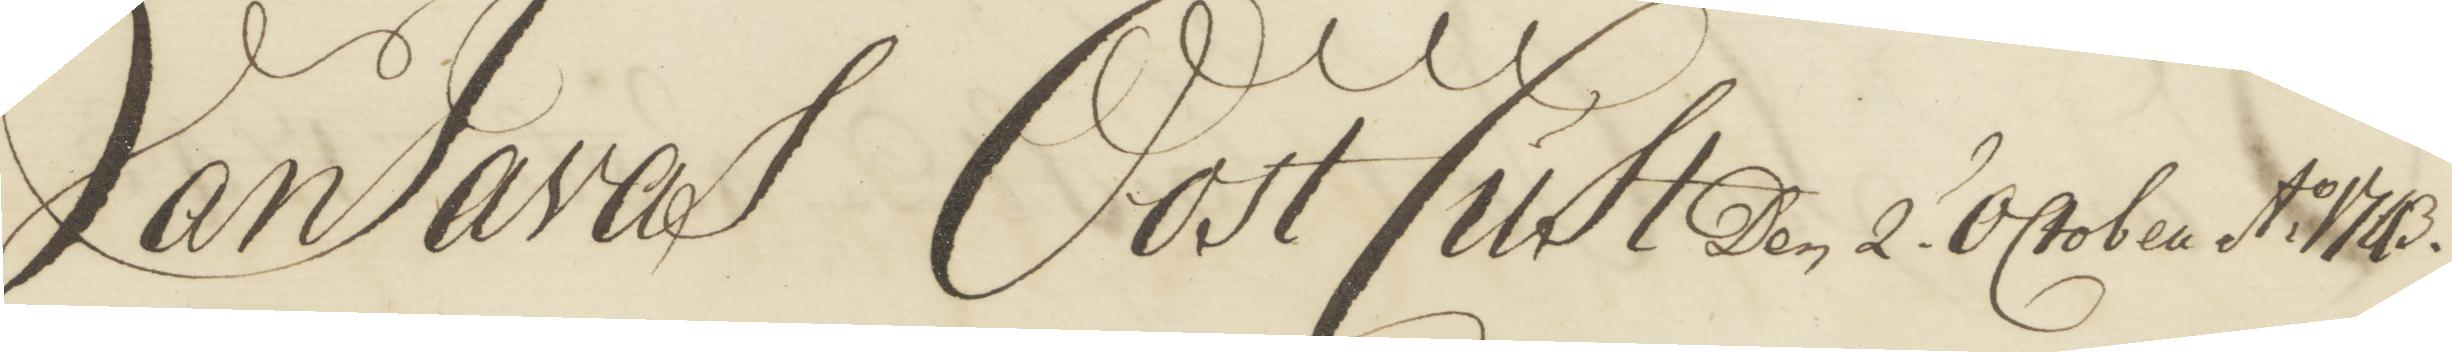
Van Javas Oost Cust Den 2.' October A:o 1743.
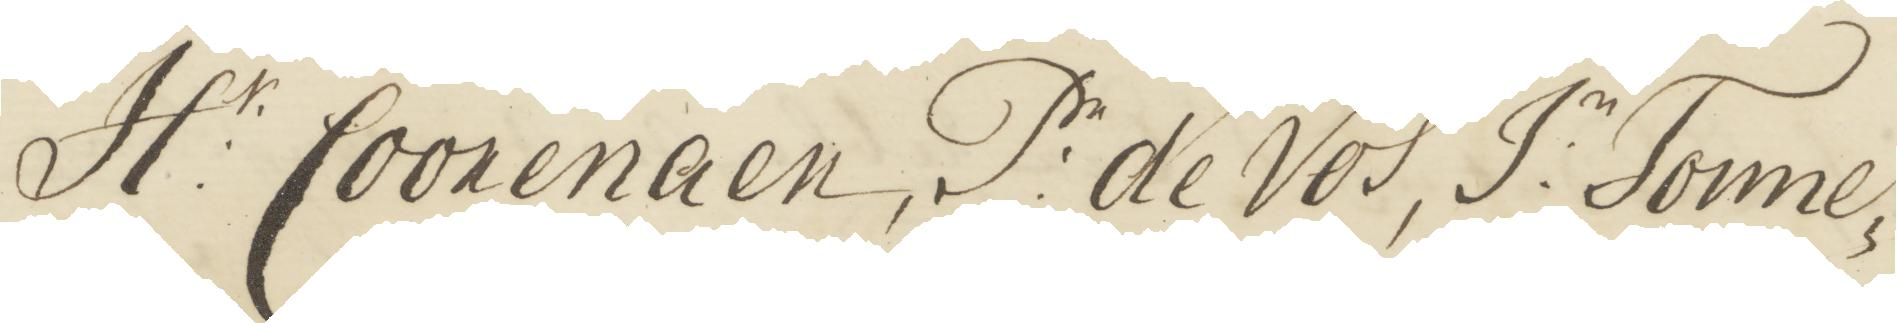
H:k Coorenaen, P:r de Vos, J:n Tonne„
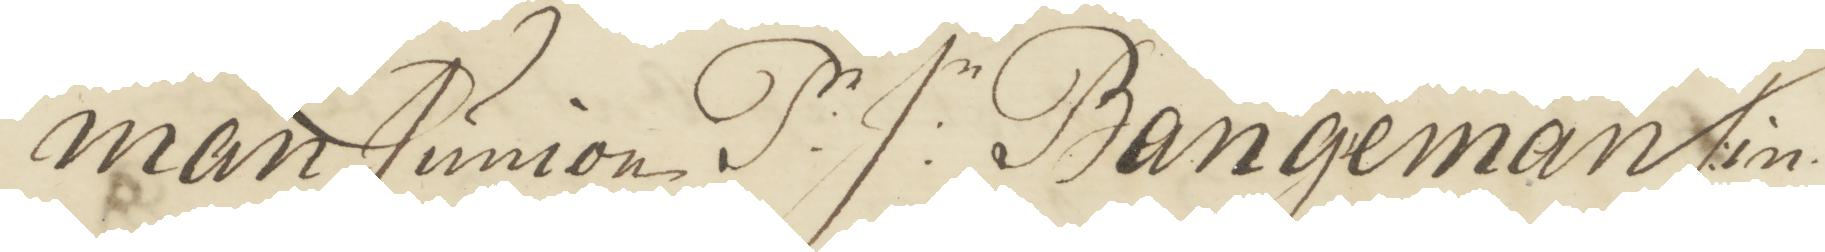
man Junior P:r J:n Bangeman /:in
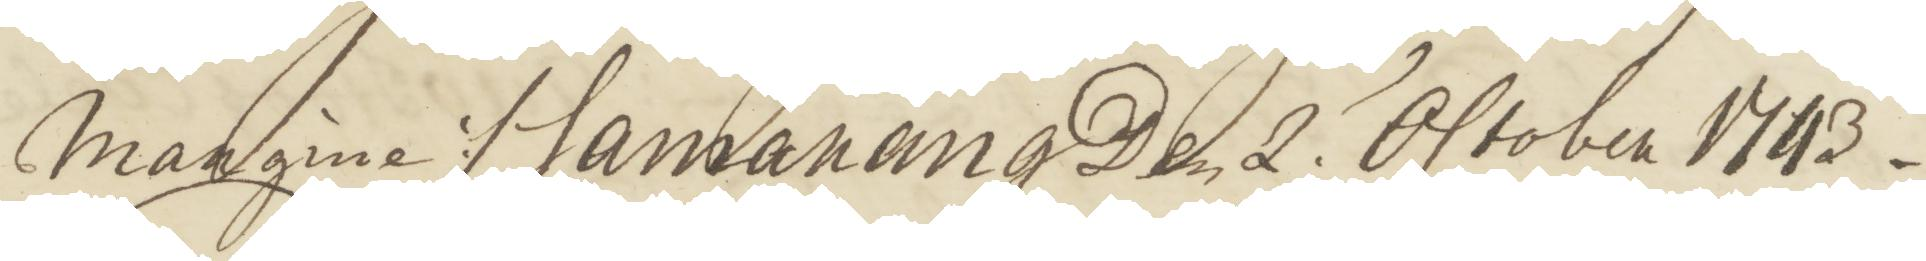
margine:/ samarang Den 2.' October 1743.
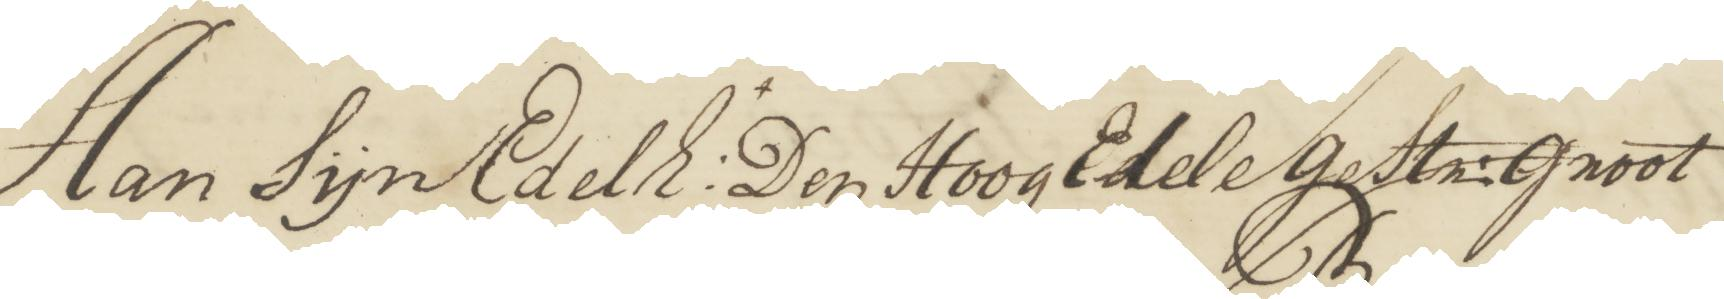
Aan sijn Edelh:t Den Hoog Edele gestr: groot
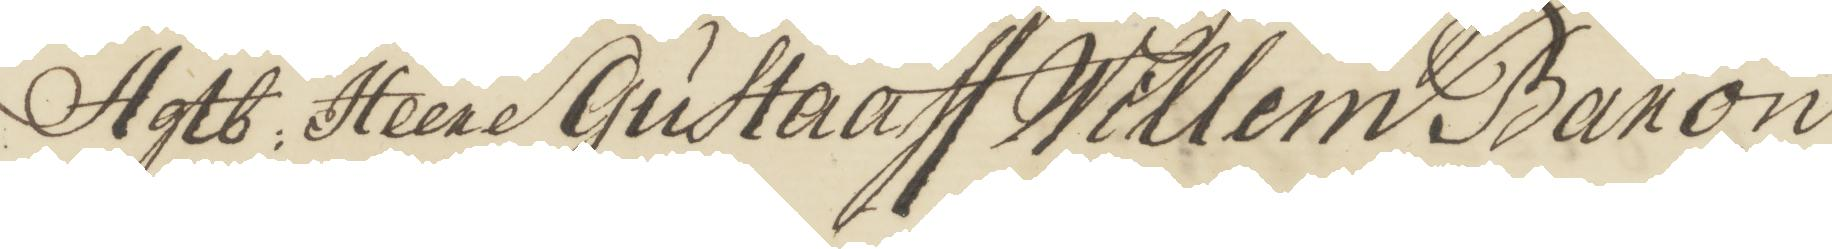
Agtb: Heere Gustaaff Willem Baron
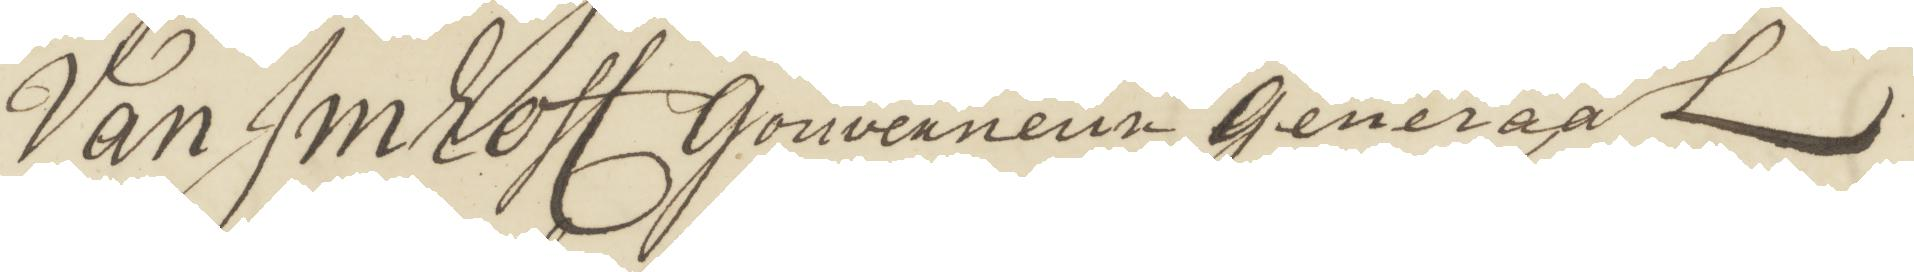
van Jmhoff gouverneur generaal
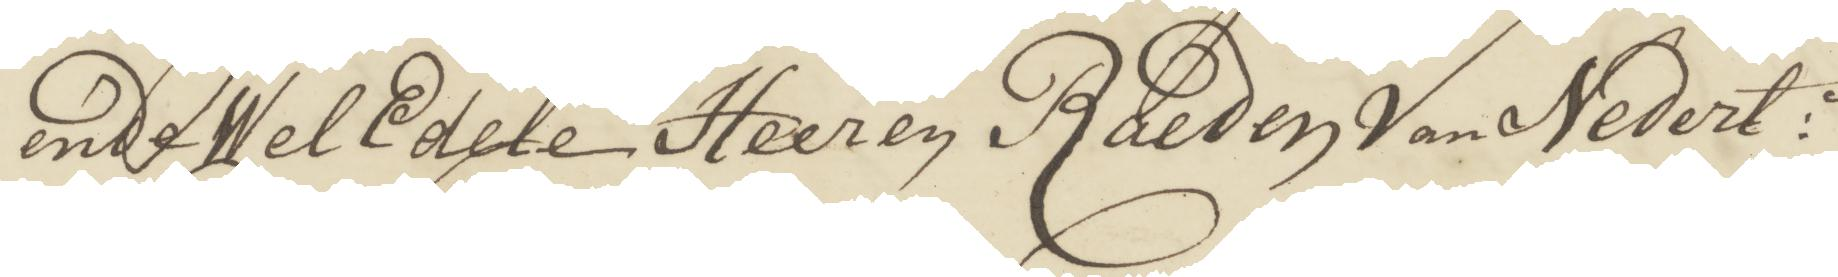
ende Wel Edele Heeren Raeden van Nederl:s
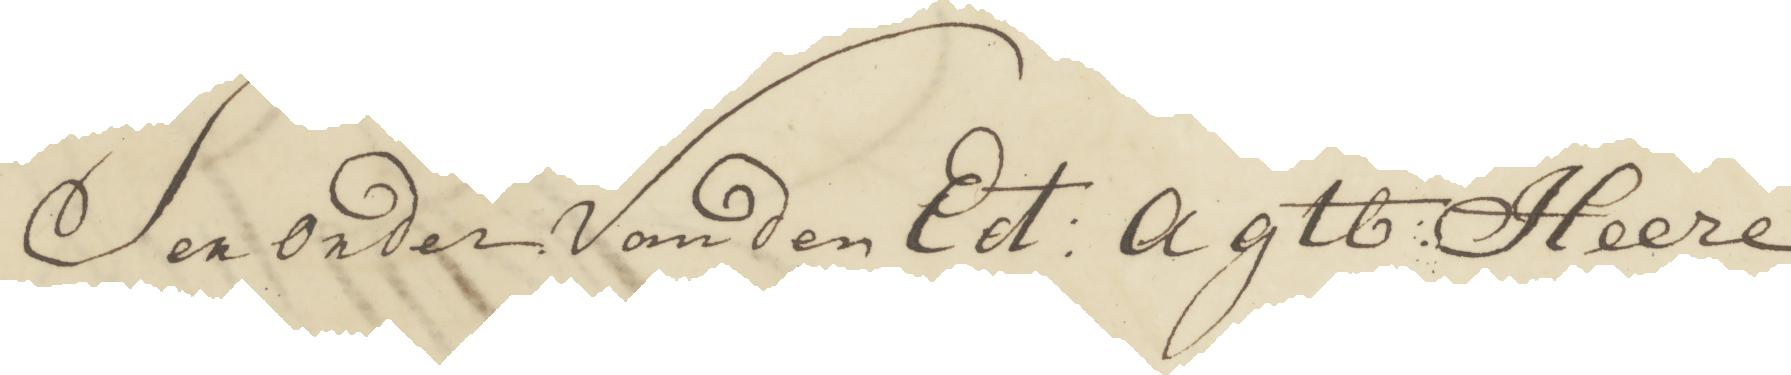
Ter order van den Ed: agtb: Heere
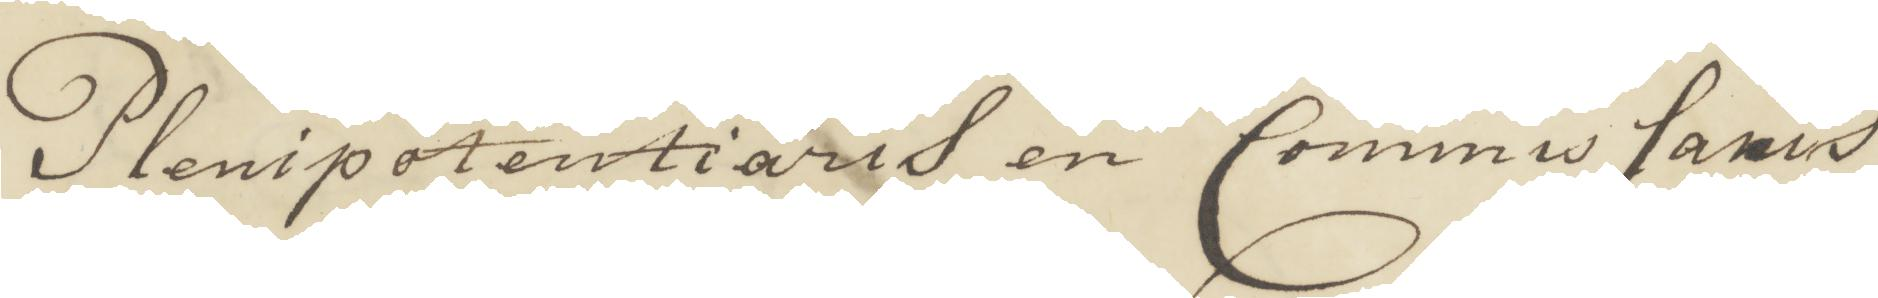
Plenipotentiaris en Commissaris,
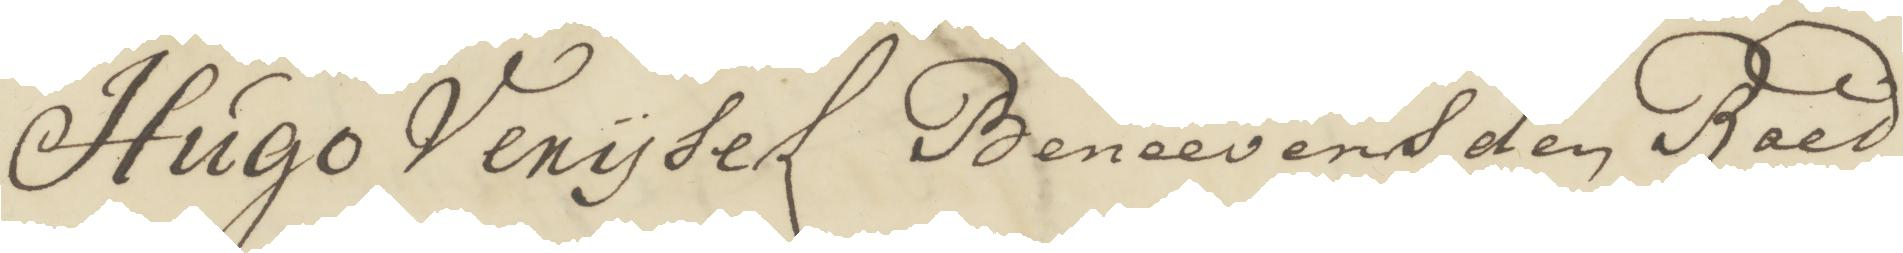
Hugo Verijsel Beneevens den Raed
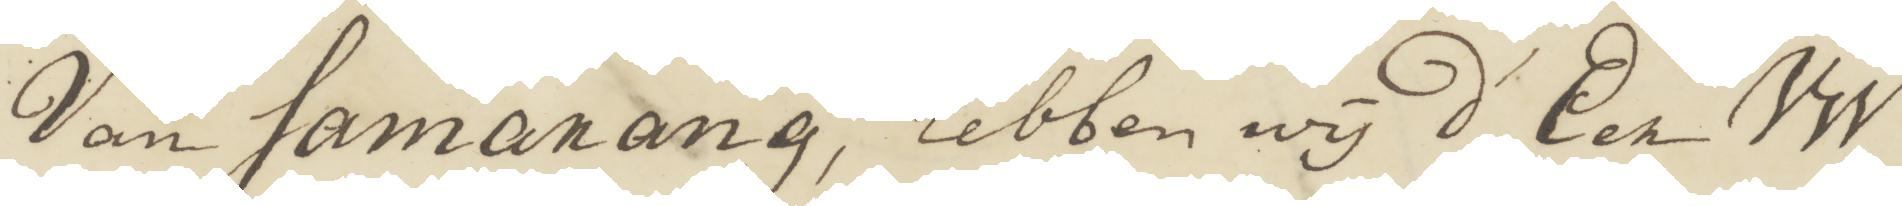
Van samarang, hebben wij d’Eer Vw
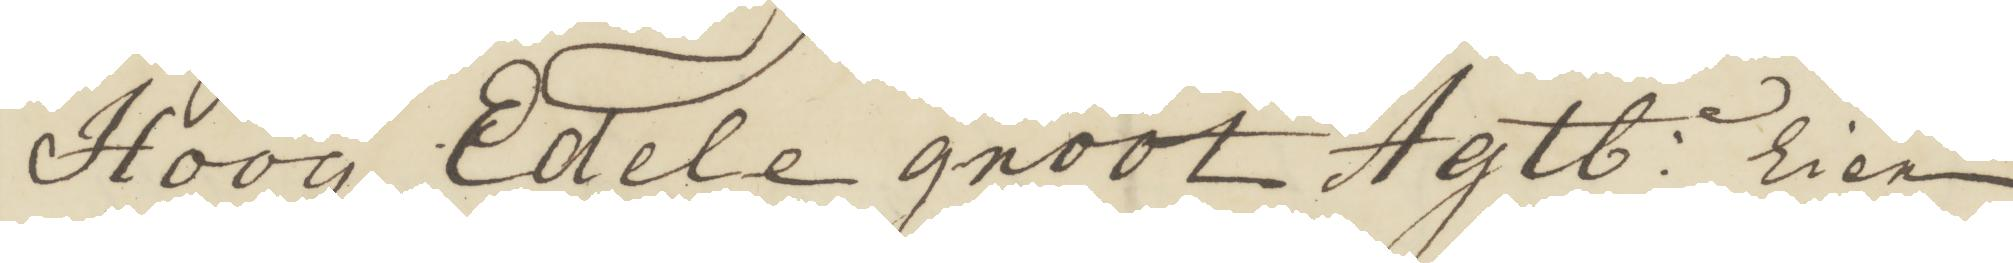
Hoog Edele groot Agtb:e hier
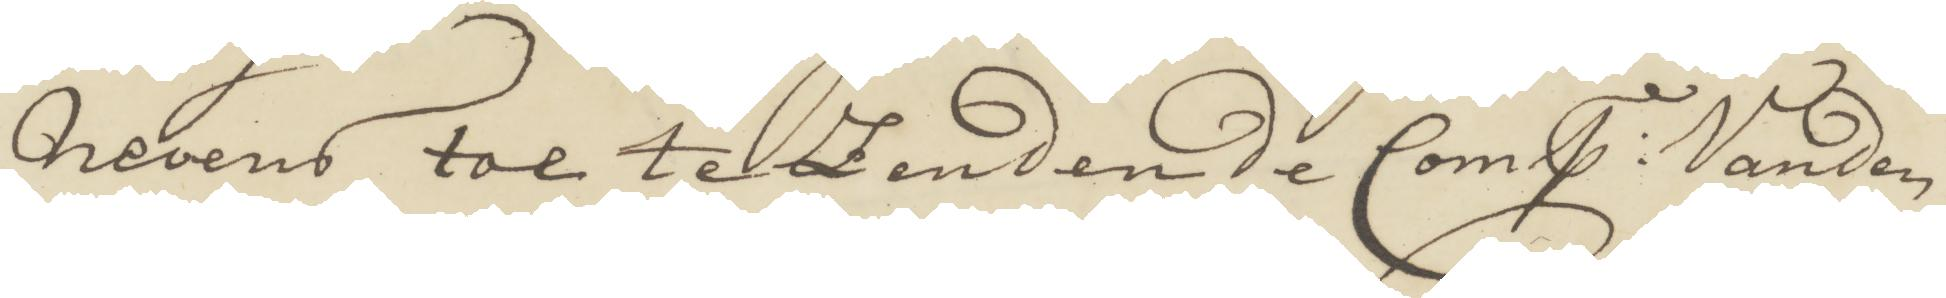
nevens toe te zenden de Comp:e van den
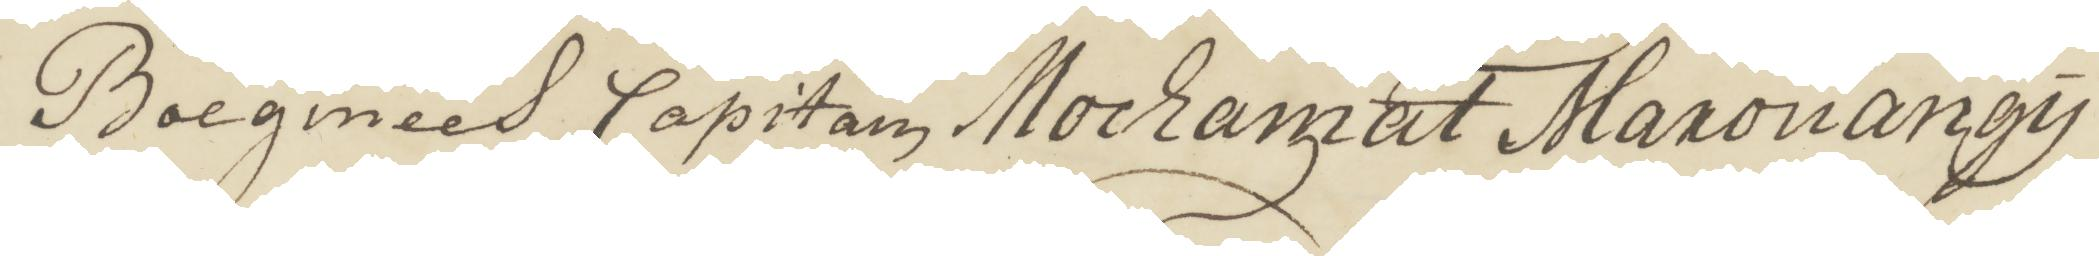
Boeginees Capitain Mochamat Marouangij
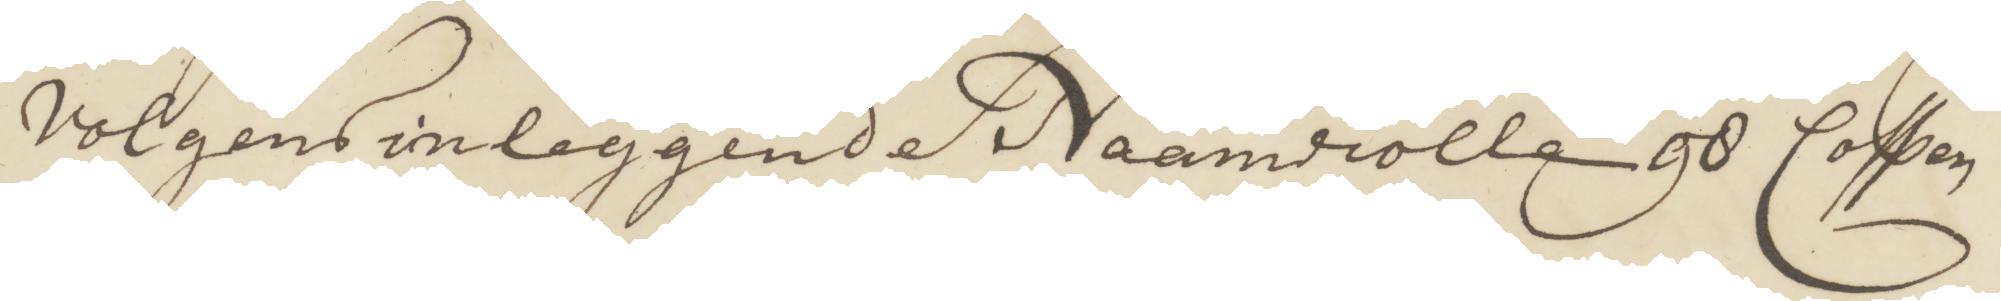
volgens inleggende Naamerolle 98 Coppen
